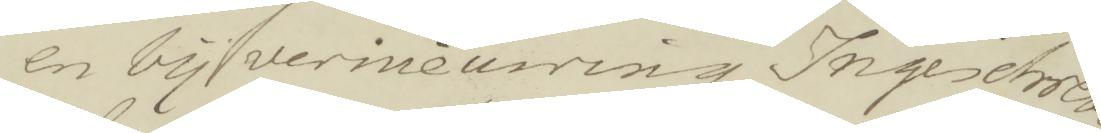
en bij vernieuwing Ingeschreven
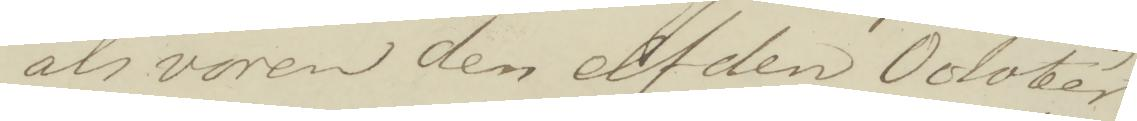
als voren den elfden October
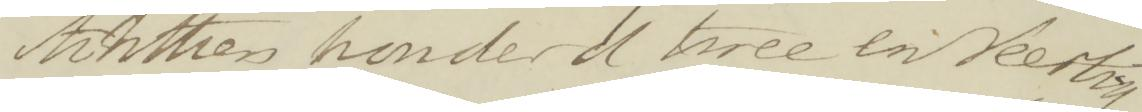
Achttien honderd twee en Veertig
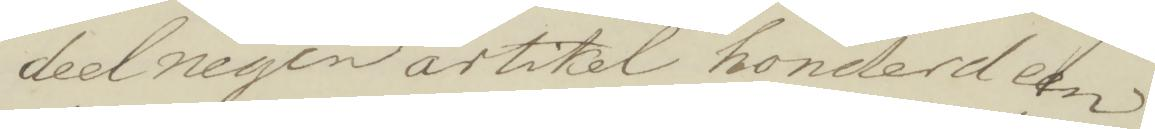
deel negen artikel honderd een
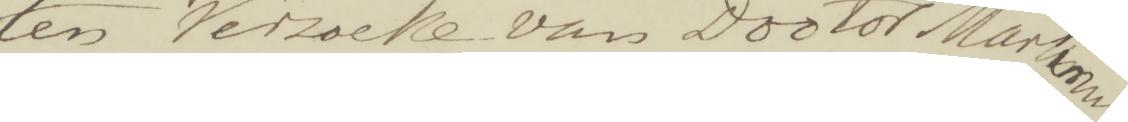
ten Verzoek van Doctor Martinus
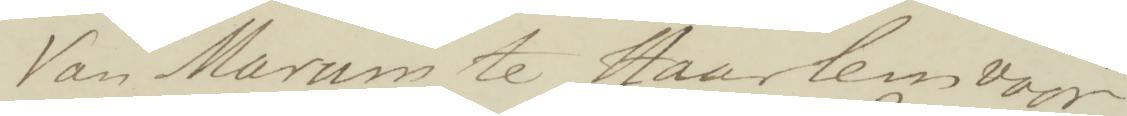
Van Marum te Haarlem voor
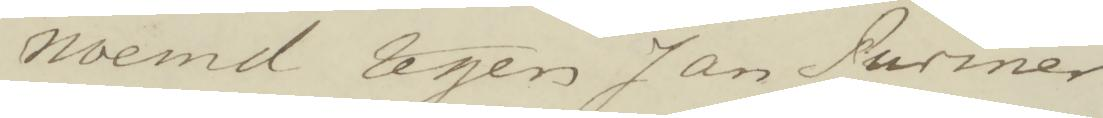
noemd tegen Jan Purmer
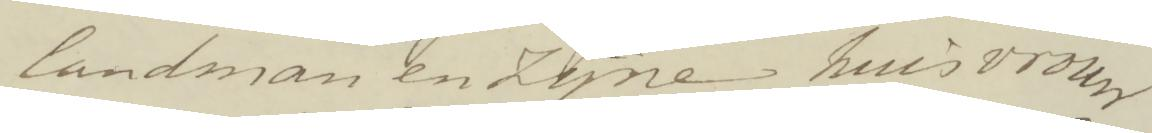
landman en zijne huisvrouw
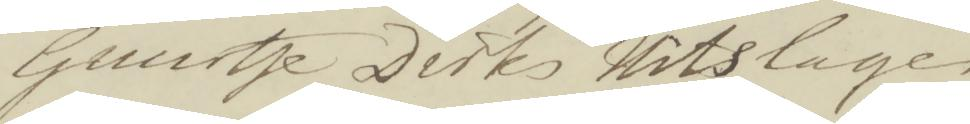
Guurtje Derks Witslager
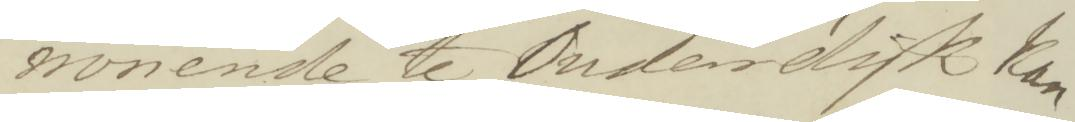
wonende te Oudendijk kan
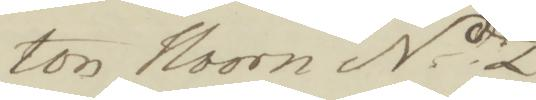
ton Hoorn N:o 2 provincie
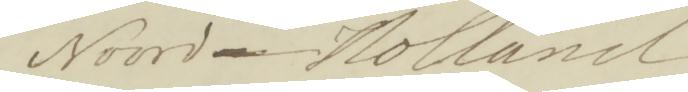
Noord-Holland
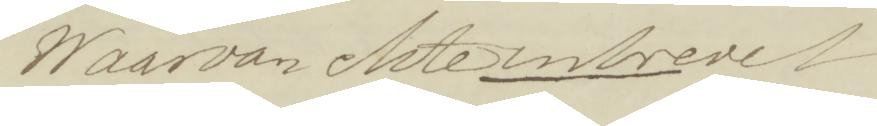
Waarvan Acte inbrevet
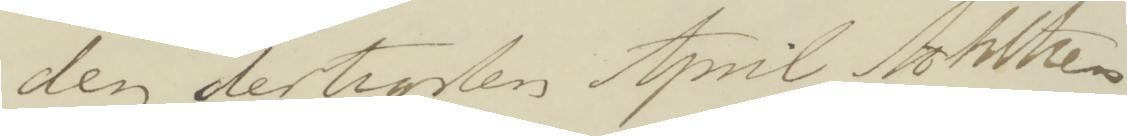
den dertigsen April Achttien
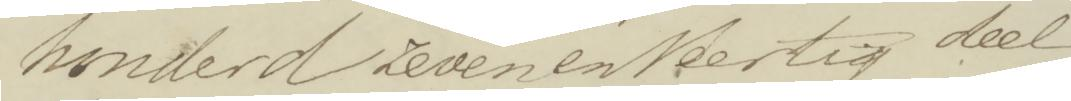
honderd zeven en Veertig deel
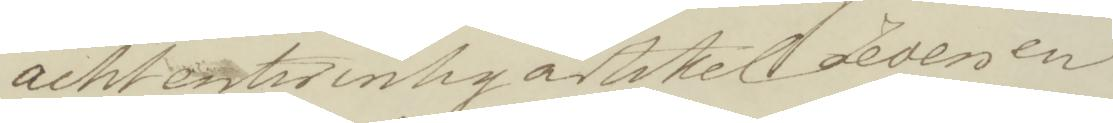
achtentwintig artikel Zeven en
